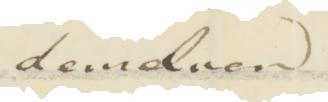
dencelven
